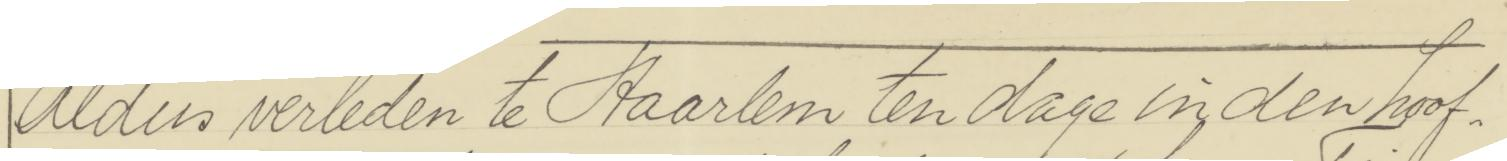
Aldus verleden te Haarlem ten dage in den hoof„
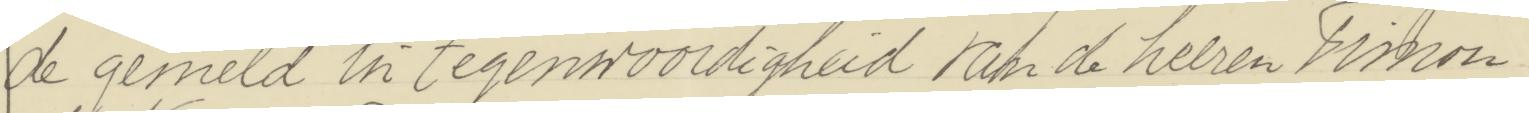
de gemeld in tegenwoordigheid van de heeren Timon
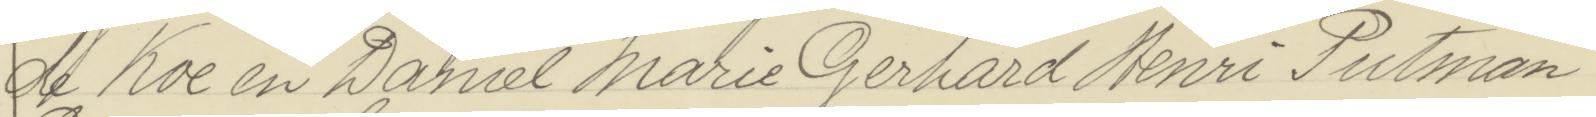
de Koe en Daniel Marie Gerhard Henri Putman
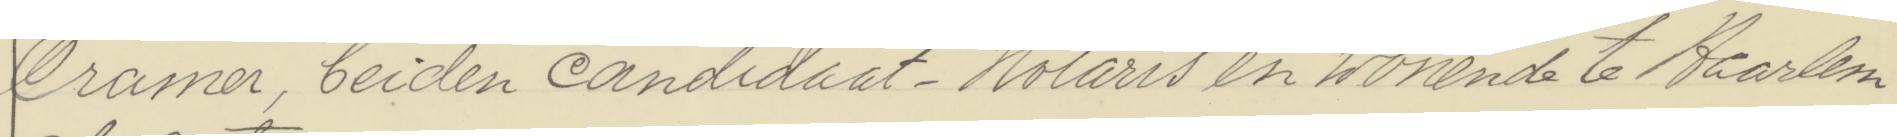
Cramer, beiden candidaat - Notaris en wonende te Haarlem
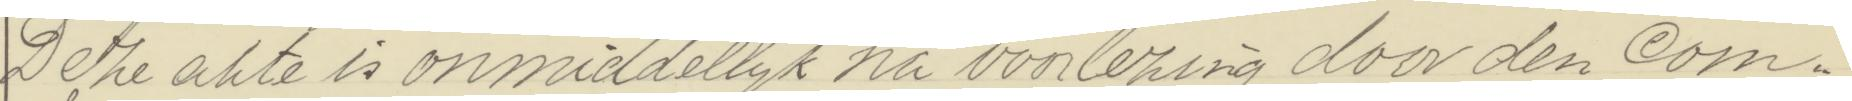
Deze akte is onmiddellyk na voorlezing door den Com„
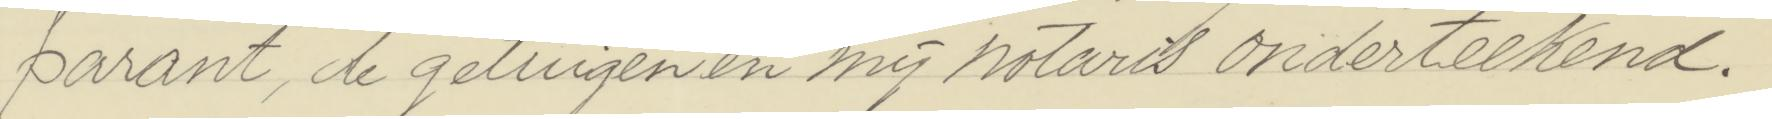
parant, de getuigen en mij notaris onderteekend.
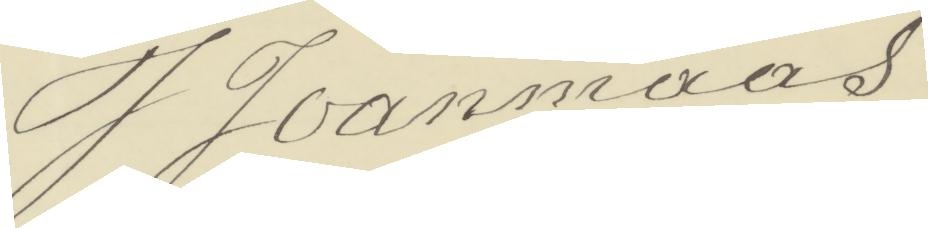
J Joanmaas
